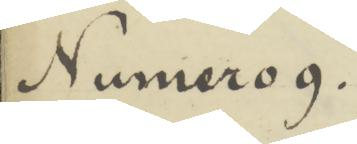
Numero 9.
